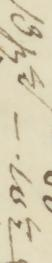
13 pCt —. 10½
